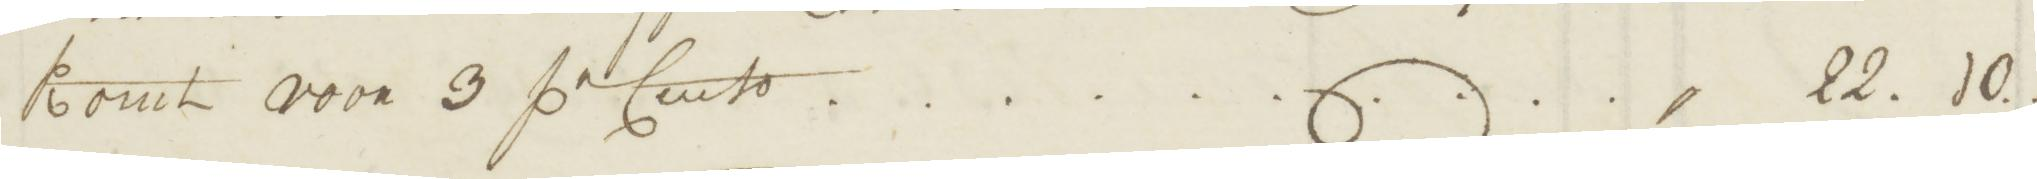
komt voor 3 prCento . . . . . . . . . . „ 22. 10.
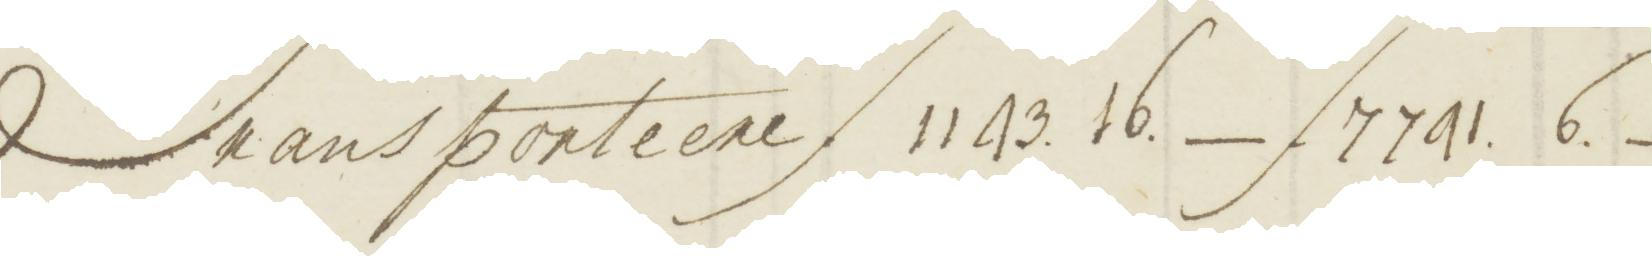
Transporteere ƒ 1143. 16. — ƒ7741. 6. —
